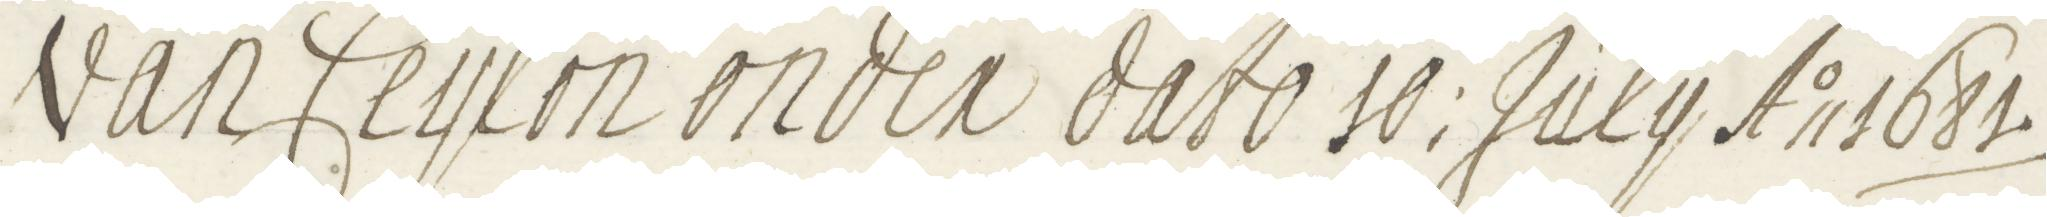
Van Ceijlon onder dato 10:e Julij A„o 1681
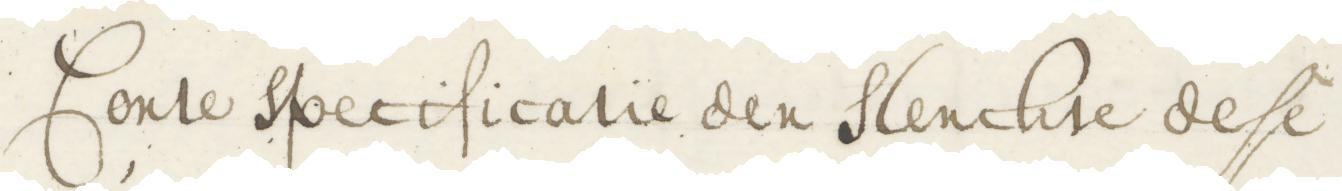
Corte specificatie der sterckte dese
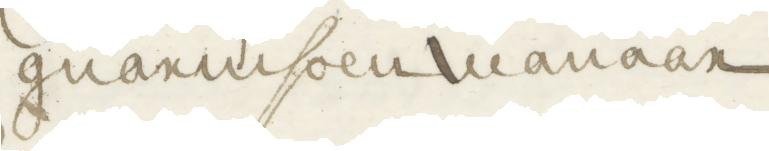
guarnisoen manaar
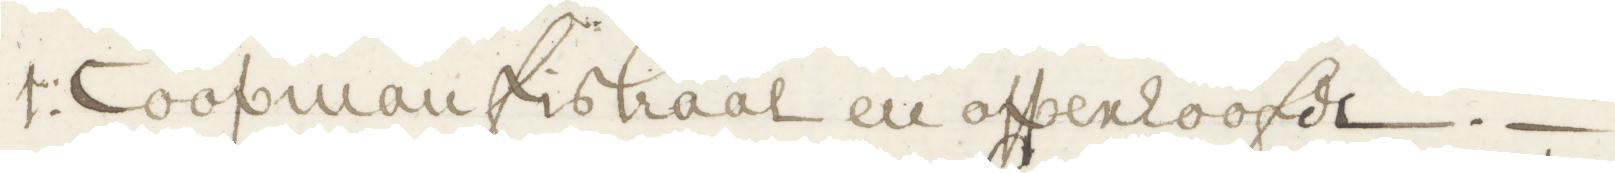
1: Coopman fiskaal en opperhoofdt. —
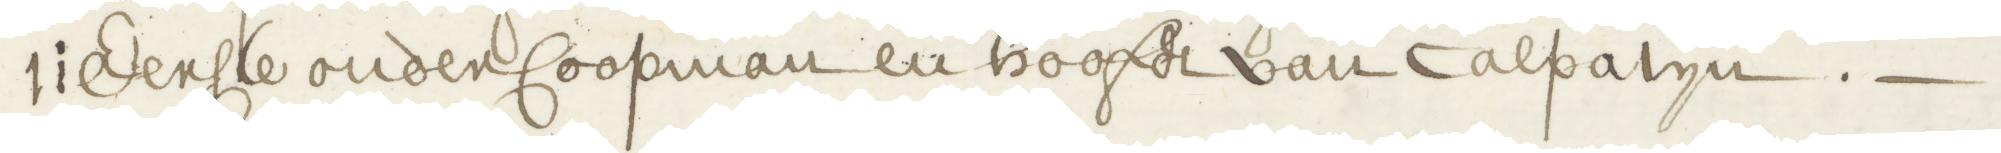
1: Eerste onder Coopman en hoofdt van calpatijn. —
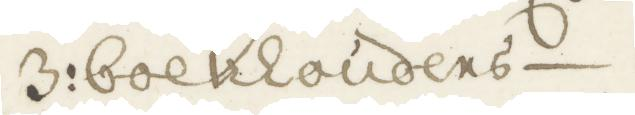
3: boekhouders —
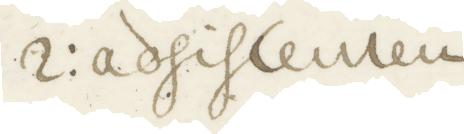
2: adsistenten
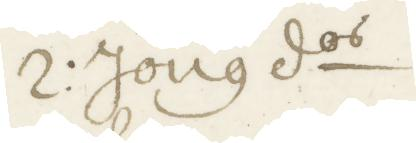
2: Jong d:os
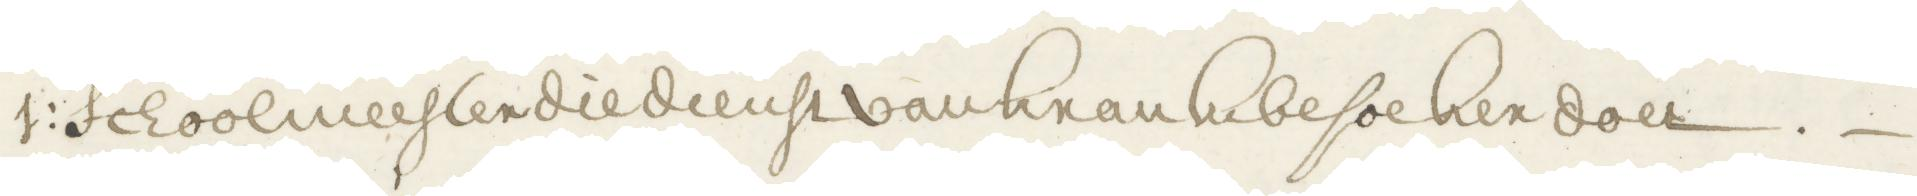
1: schoolmeester die dienst van krankbesoeker doet. —
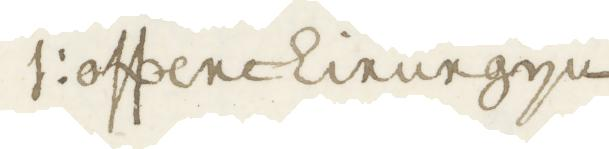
1: opperchirurgijn
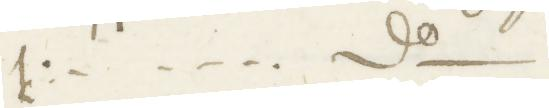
1: - ---. d:o
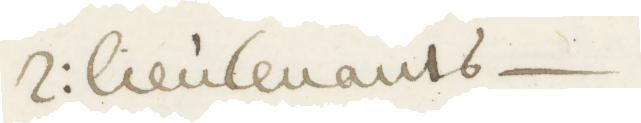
2: lieutenants —
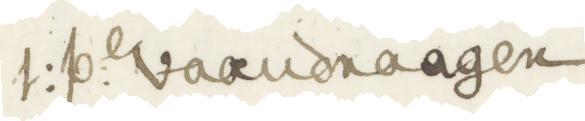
1: p:l vaandraager
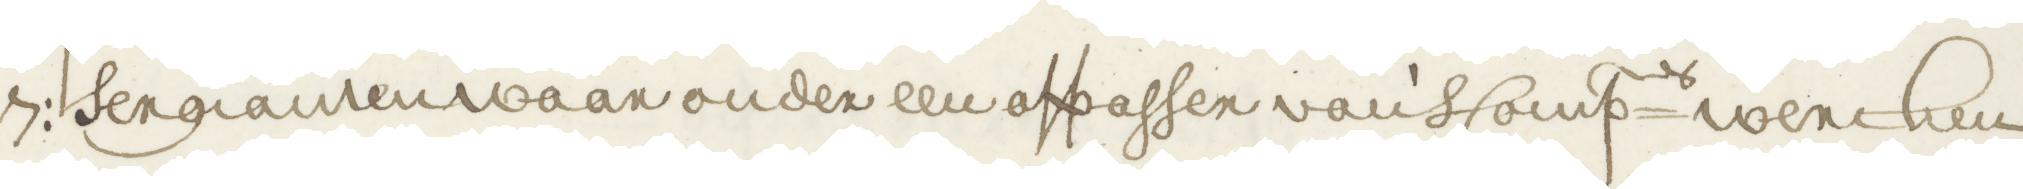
7: sergianten waar onder een oppasser van ’s Comp=es wercken
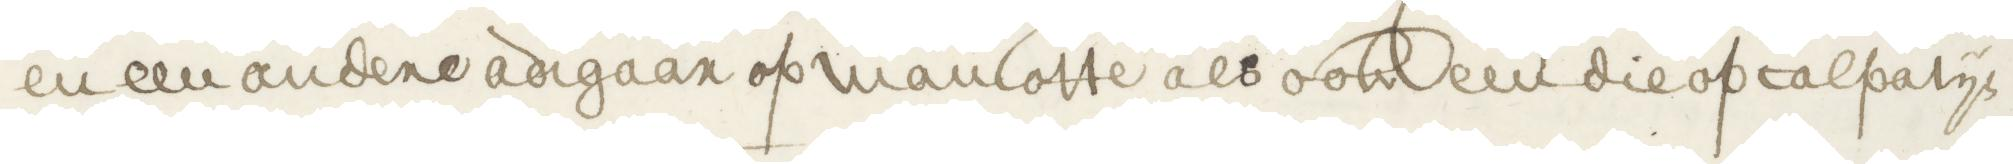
en een andere adigaar op mantotte als ook een die op calpatijn
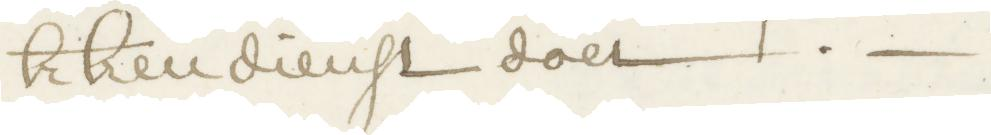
k ken dienst doet. —
